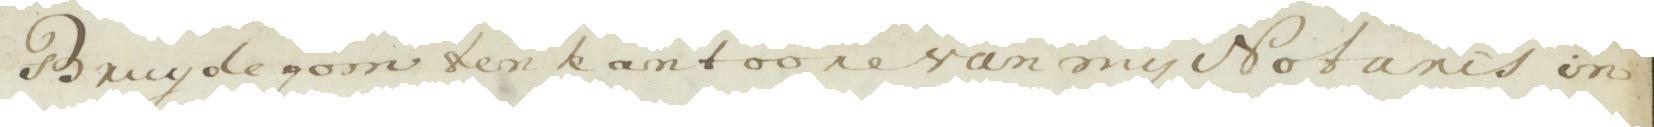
Bruydegom ten kantoore van mij Notaris in
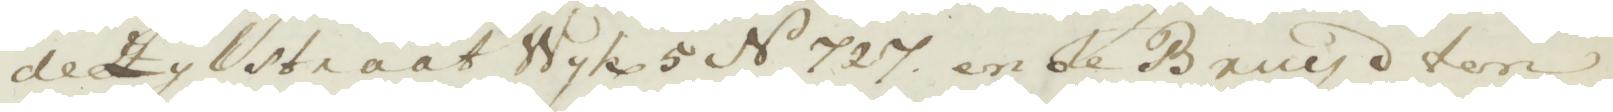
de Zylstraat Wyk 5 No 727. en de Bruyd ten
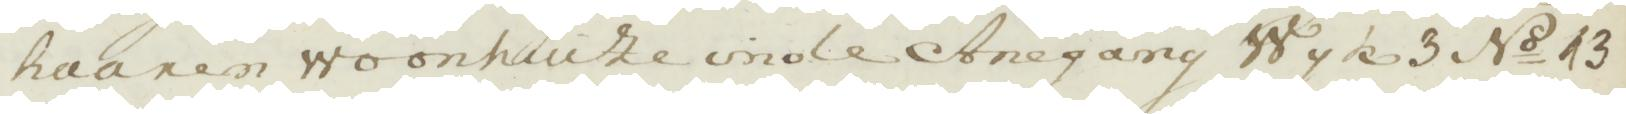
haaren woonhuize inde Anegang Wyk 3 N=o 13
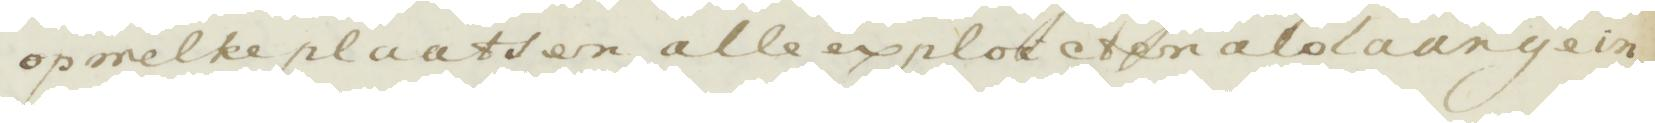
op welke plaats en alle exploicten aldaar gein
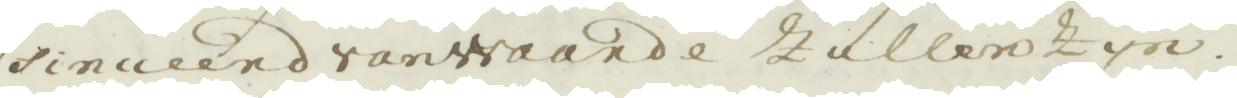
sinueerd van waarde zullen zyn.
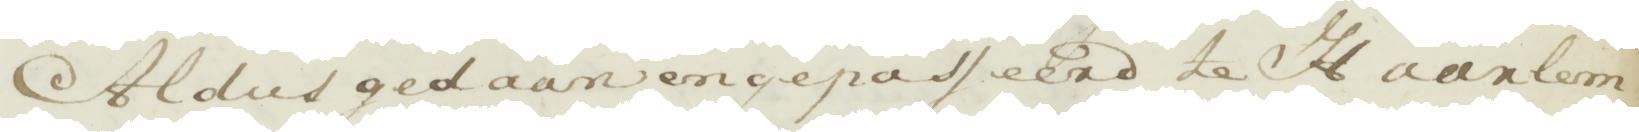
Aldus gedaan en gepasseerd te Haarlem
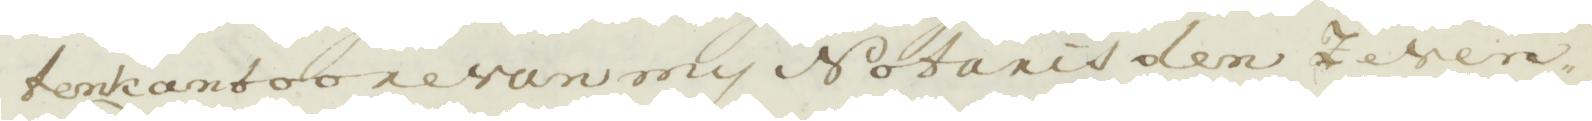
ten kantoore van mij Notaris den zeven„
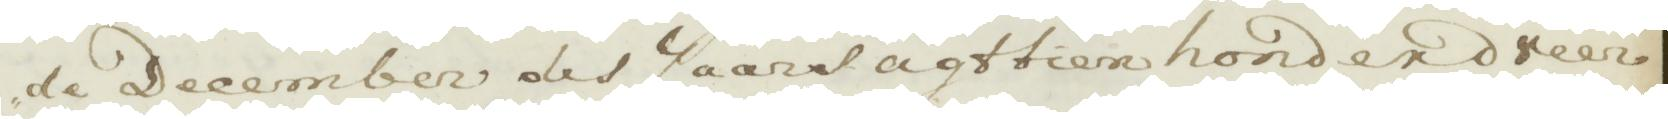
„de December des Jaars agttien honderd veer
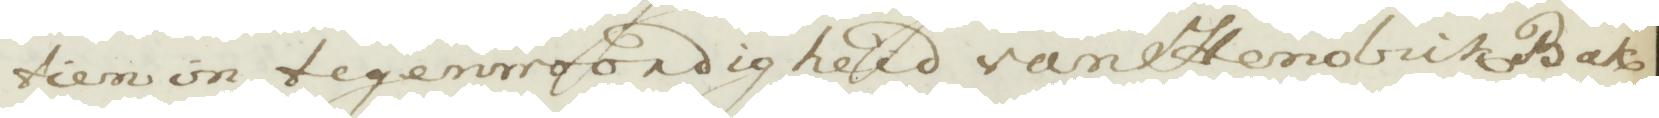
tien in tegenwoordigheid van Hendrik Bak
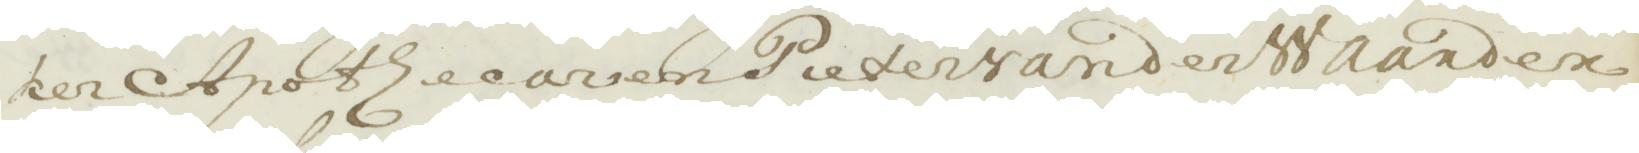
ker Apothecar en Pieter van der Waarden
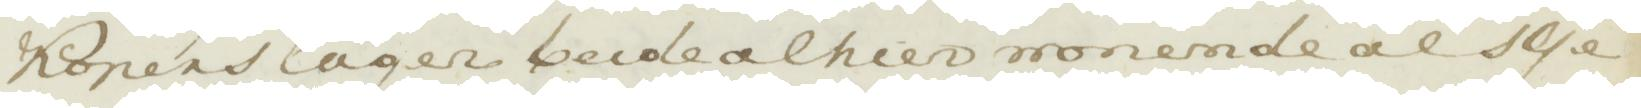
Koperslager beide alhier wonende als ge
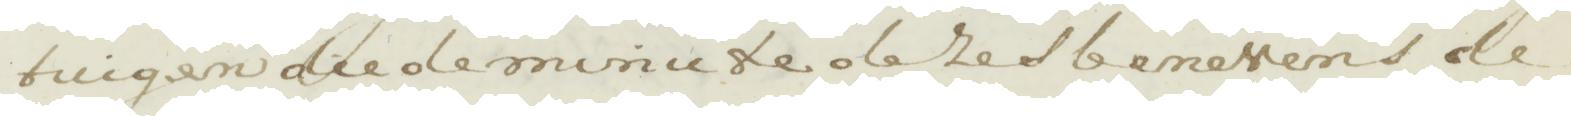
tuigen die de minute zes benevens de
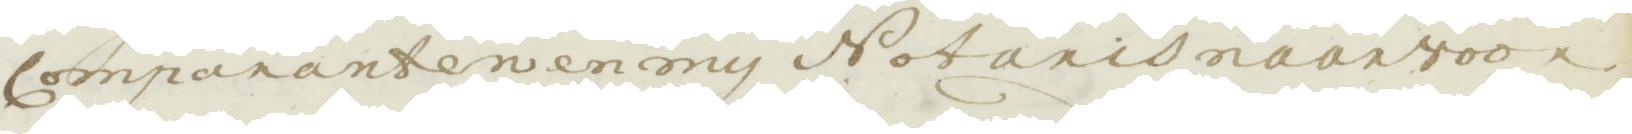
comparanten en mij Notaris naar voor
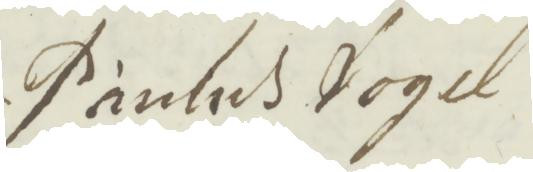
Paulus Vogel
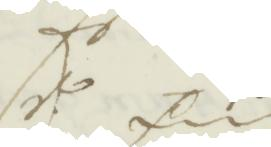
ƒ.
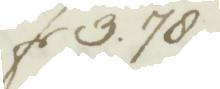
ƒ 3.78
